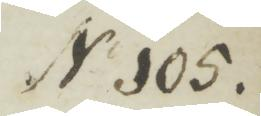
N:o 105.
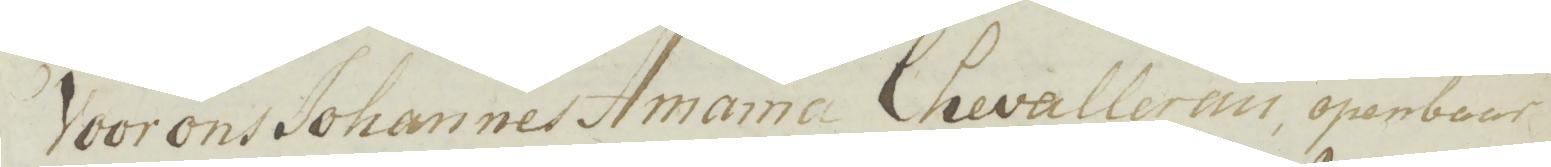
Voor ons Johannes Amama Chevallerau, openbaar
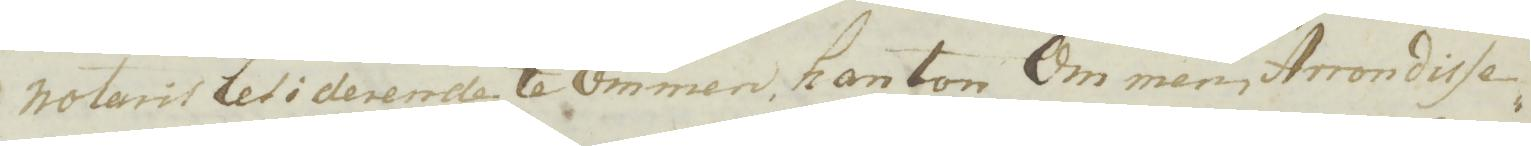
Notaris residerende te Ommen, kanton Ommen Arrondisse„
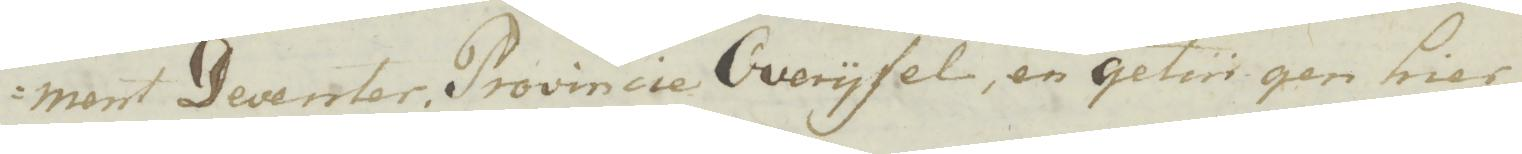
=ment Deventer, Provincie Overijsel, en getuigen hier
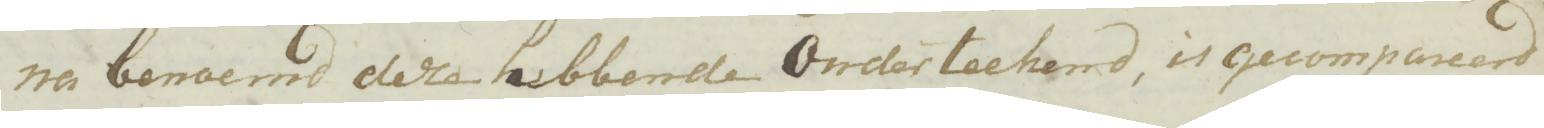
na benoemd deze hebbende Onderteekend, is gecompareerd
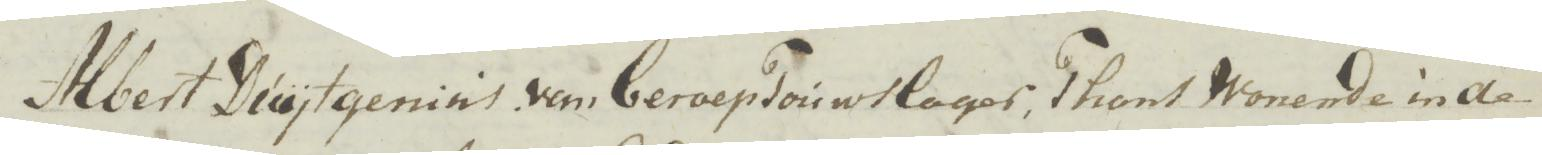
Albert Duijtgenius van beroep Touwslager, Thans wonende in de
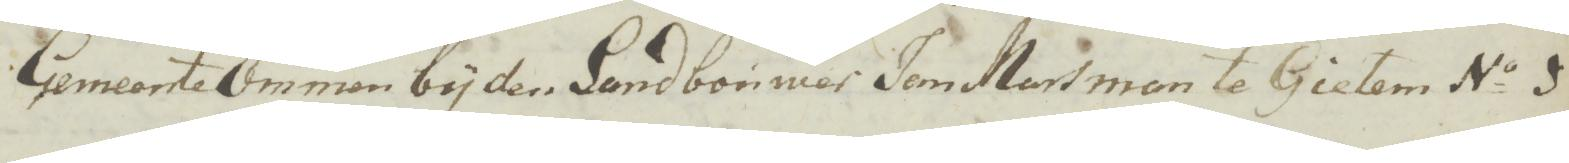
Gemeente Ommen bij den Landbouwer Ian Marsman te Gietem N=o 1
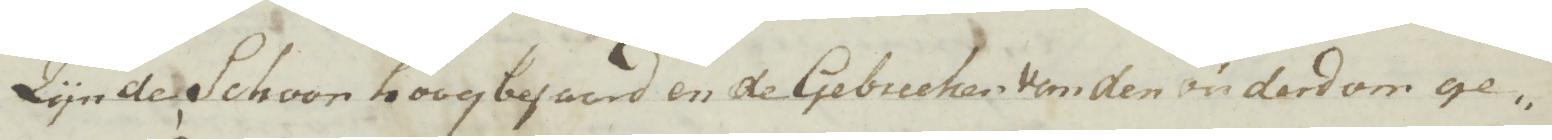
Zijnde Schoon hoogbejaard en de Gebreeken van den ouderdom ge„
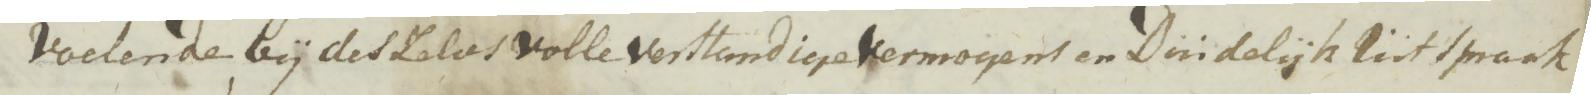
voelende bij deszelvs volle verstandige vermogens en Duidelijk uitspraak
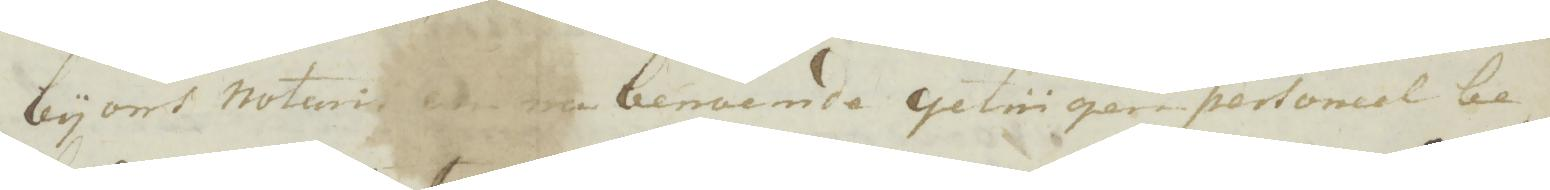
bij ons Notaris en nabenoemde getuigen personeel be„
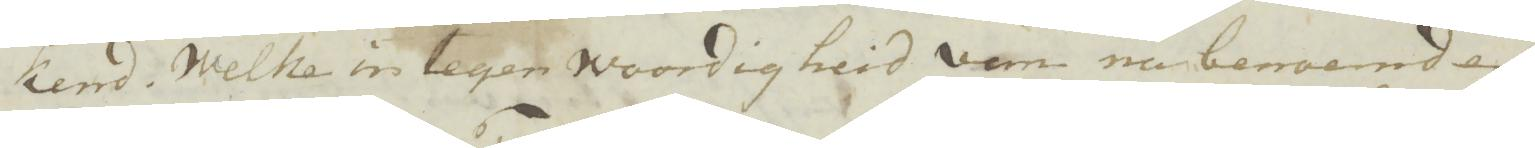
kend, welke in tegen woordigheid van na benoemde
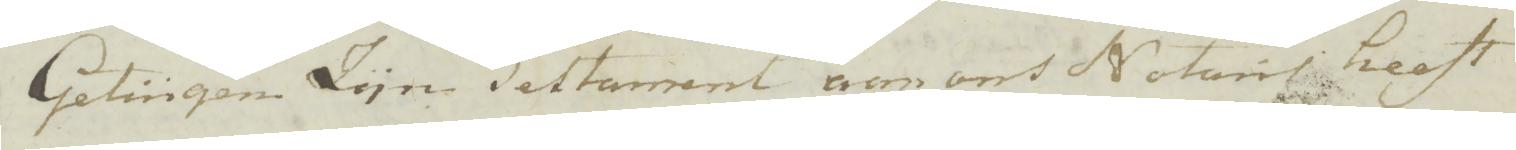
Getuigen Zijn Testament aan ons Notaris heeft
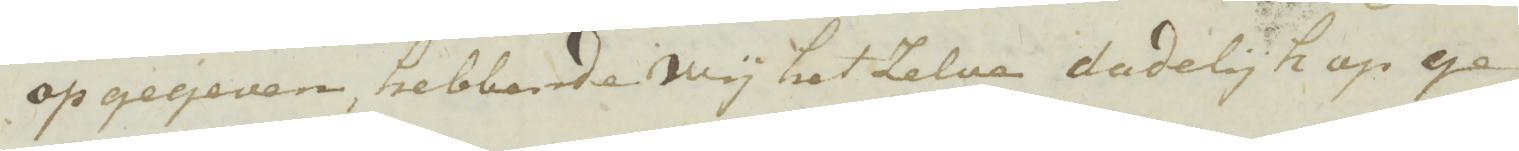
opgegeven, hebbende wij het Zelve dadelijk op ge
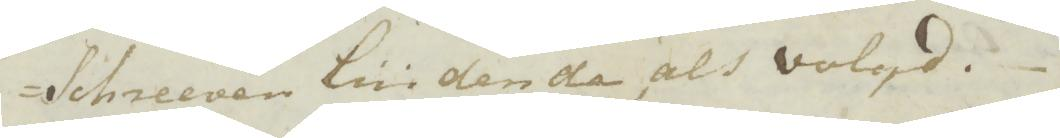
=Schreeven luidende als volgd.
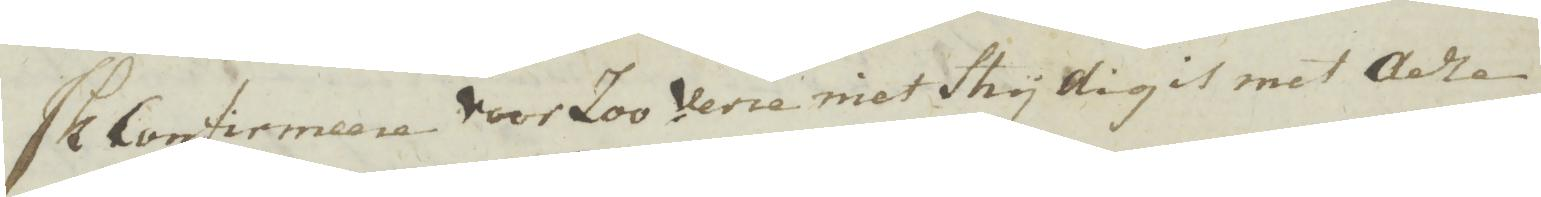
Ik Confirmeere voor Zoo verre niet Strijdig is met deze
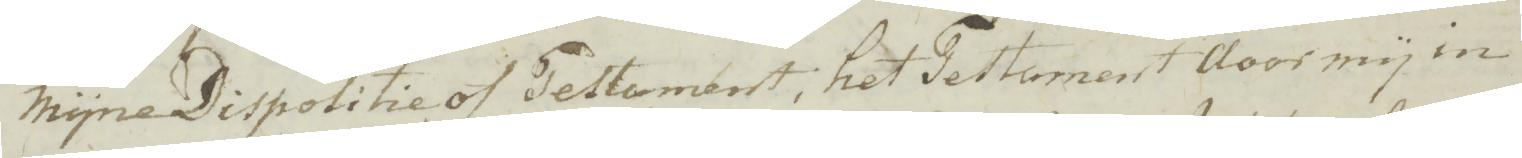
mijne Dispositie of Testament, het Testament door mij in
